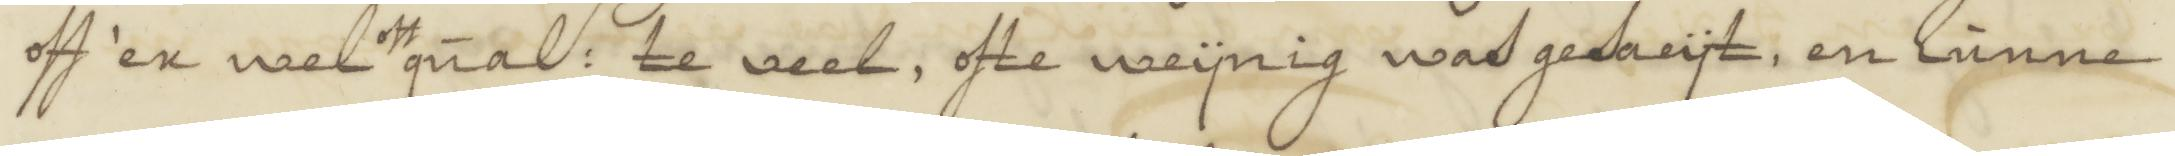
off 'er wel off qual: te veel, ofte weijnig was gesaeijt, en hunne
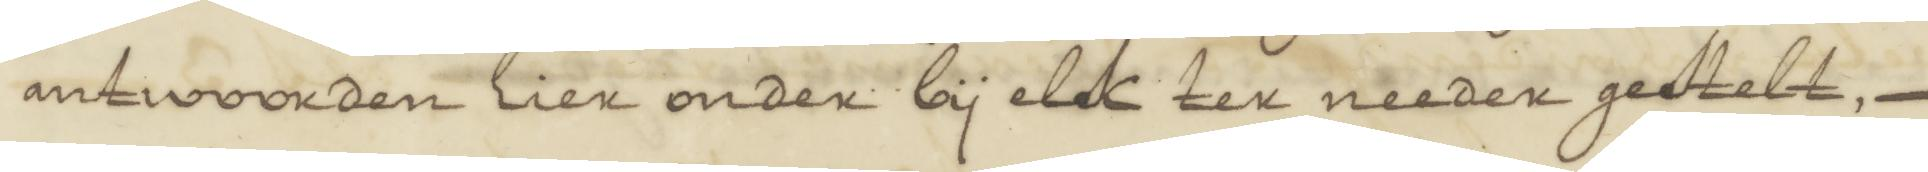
antwoorden hier onder bij elk ter needer gestelt,—
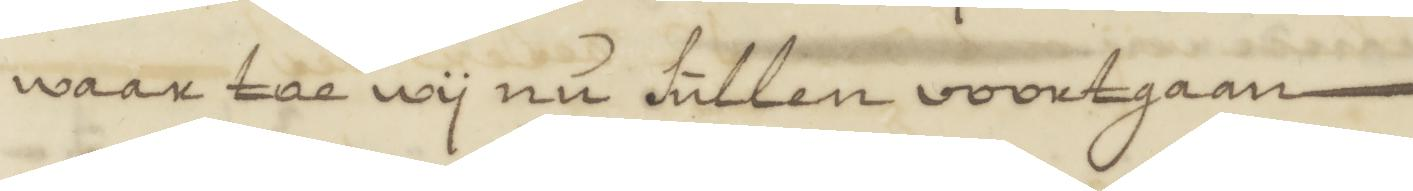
waar toe wij nu sullen voortgaan
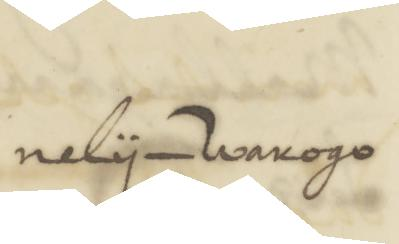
nelij - warogo
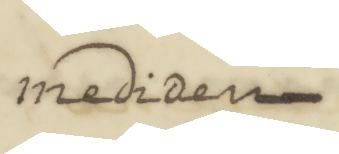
mediden
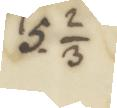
5.2/3
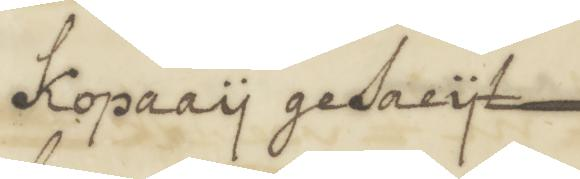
kopaaij gesaeijt
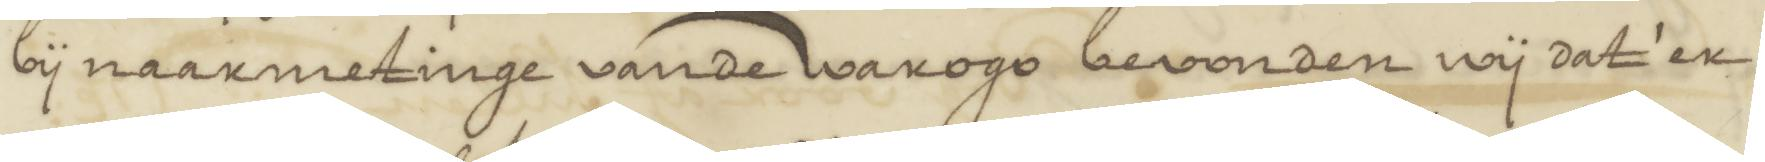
bij naarmetinge van de warogo bevonden wij dat 'er
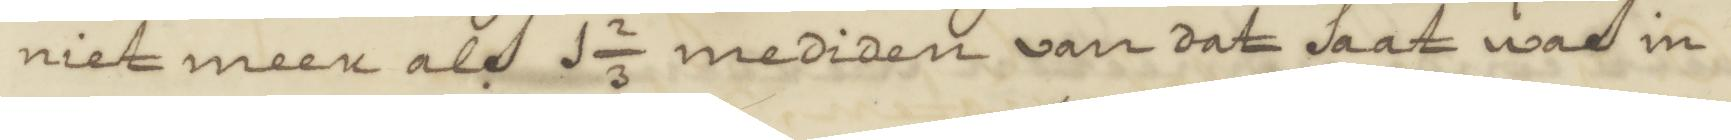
niet meer als 1 2/3 mediden van dat saat was in
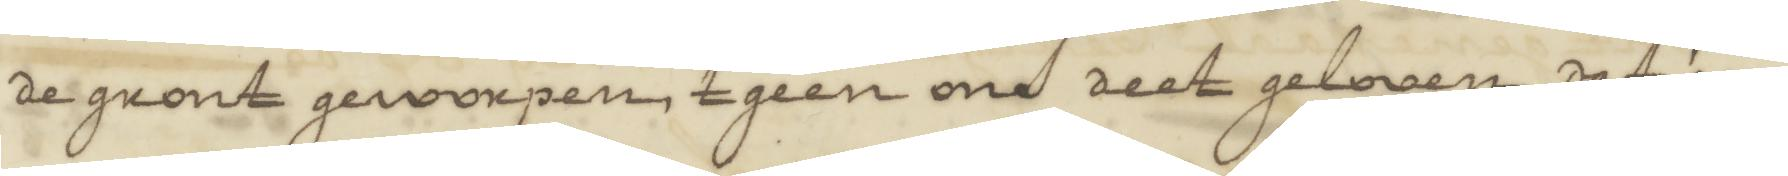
de gront geworpen, ’t geen ons deet geloven dat 'er
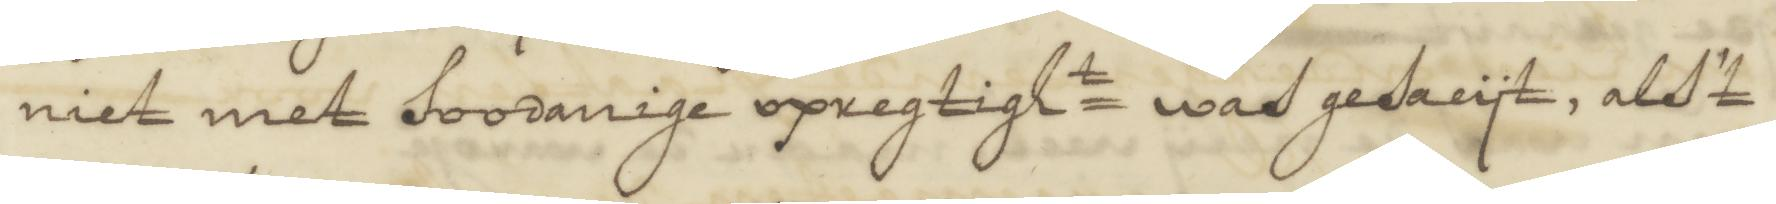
niet met soodanige opregtigh=t was gesaeijt, als ’t
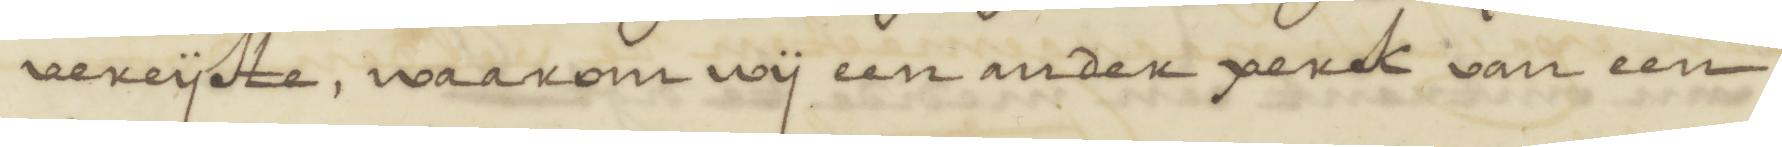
vereijste, waarom wij een ander perk van een
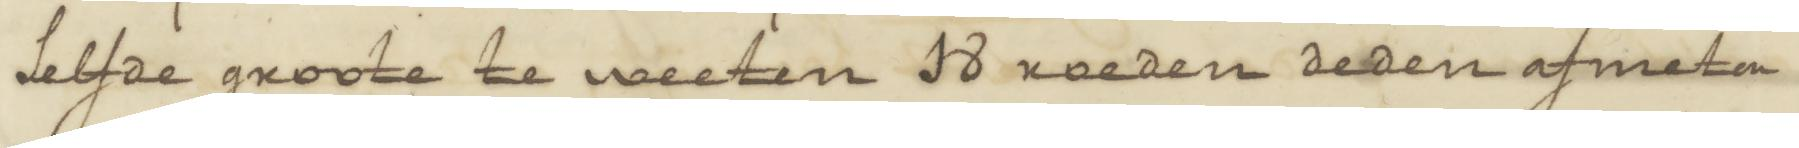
selfde groote te weeten 18 roeden deden afmeten
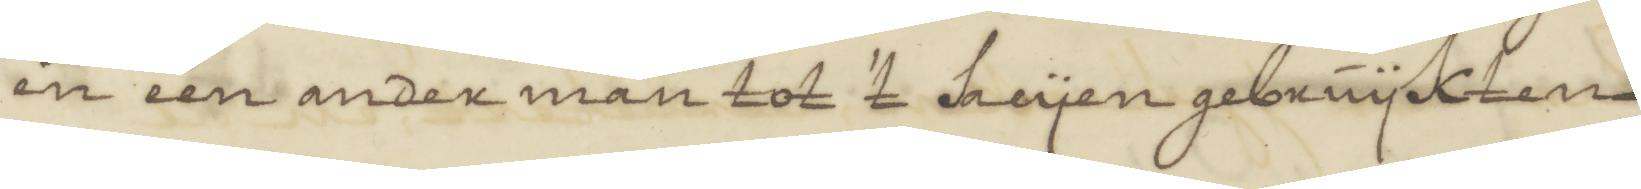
en een ander man tot ’t saeijen gebruijkten
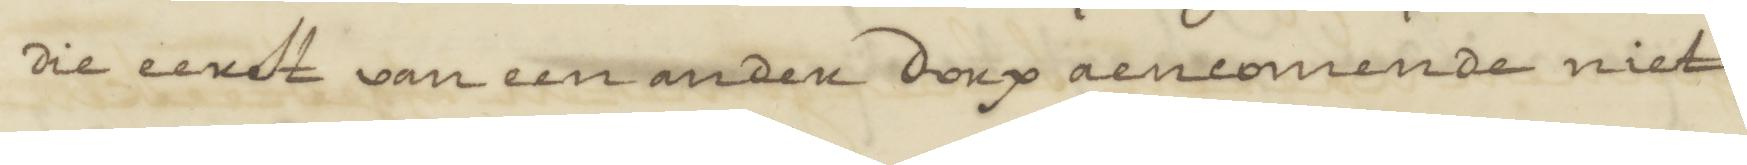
die eerst van een ander dorp aencomende niet
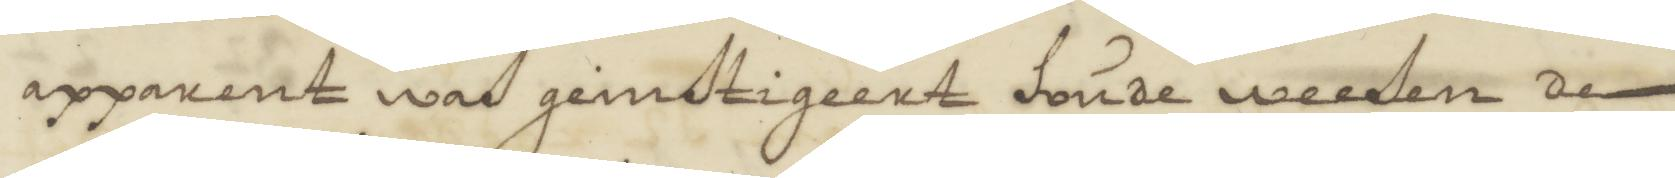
apparent was geinstigeert soude weesen de
